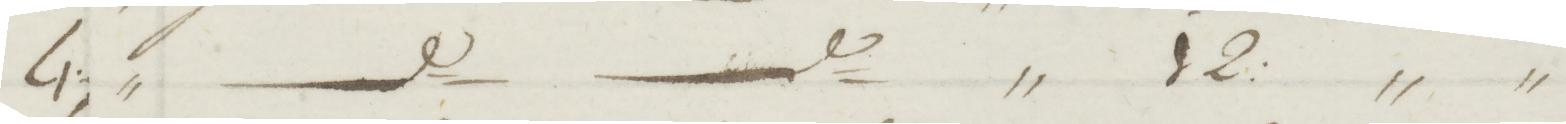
4: „ _=o _=o „ 12: „ „
